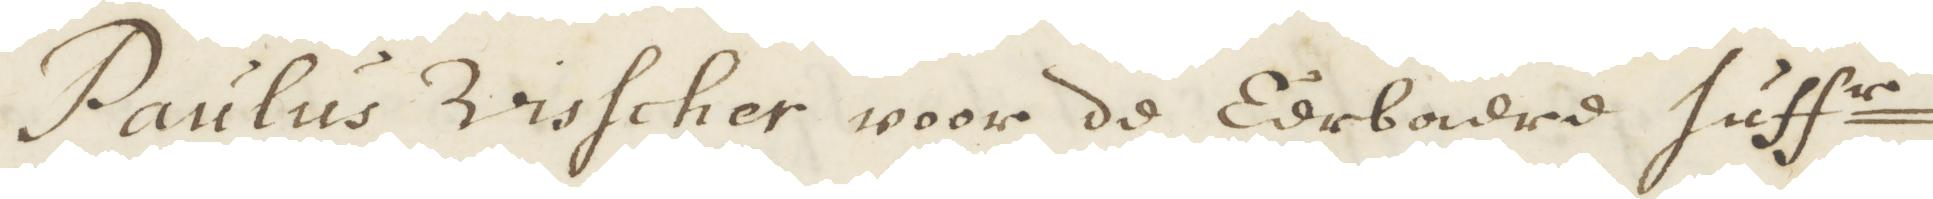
Paulus Visscher voor de Eerbaere Juff=r
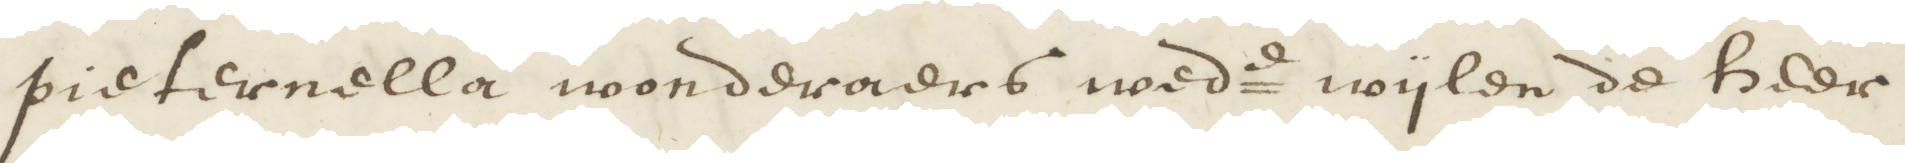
pieternella wonderaers wed=e wijlen de heer
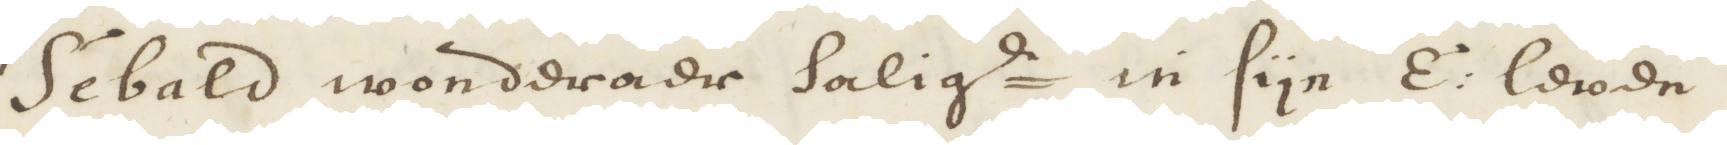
Sebald wonderaer salig=e in sijn E: leven
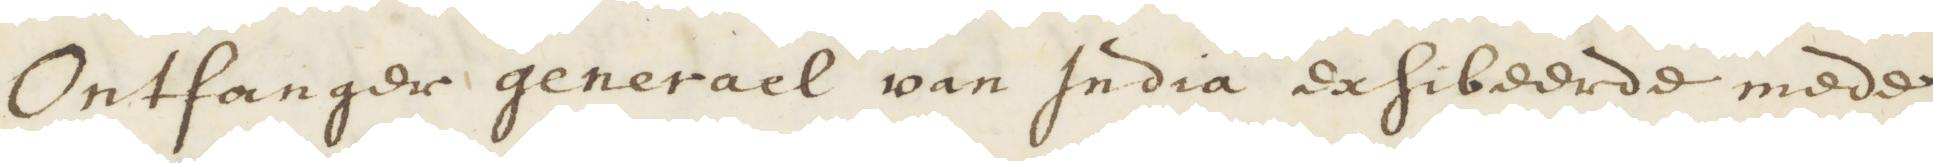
Ontfanger generael van jndia exhibeerde mede
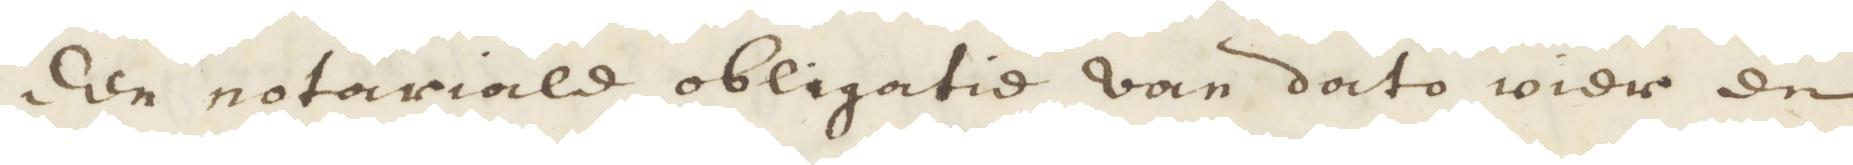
Een notariale obligatie van dato vier en
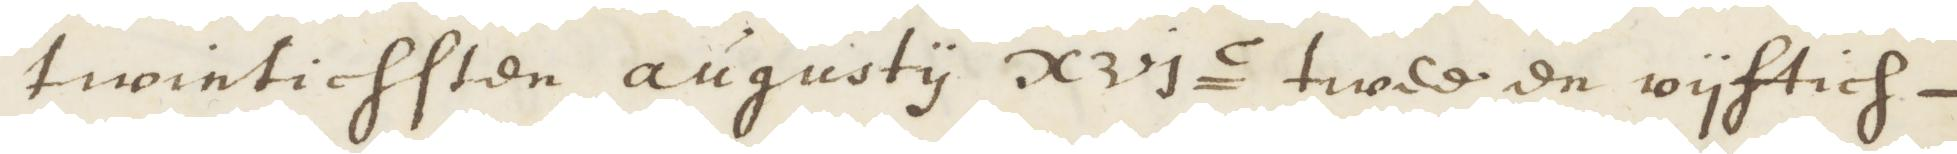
twintichsten augustij XVj=e twee en vijftich —
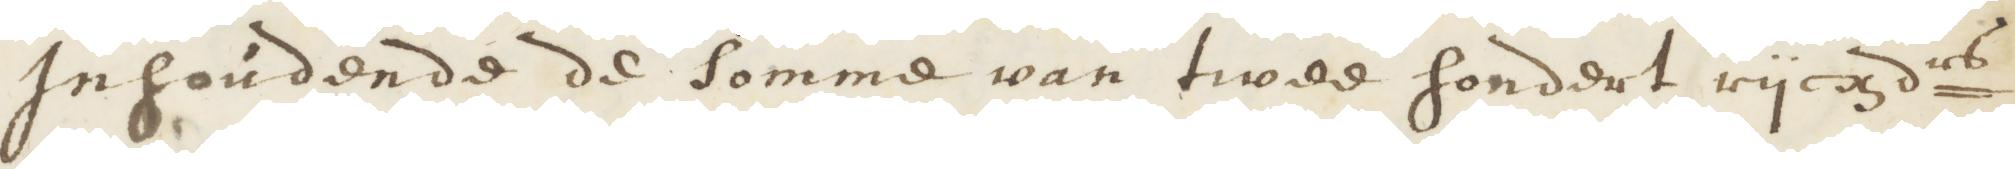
jnhoudende de somme van twee sondert rijcxd=rs
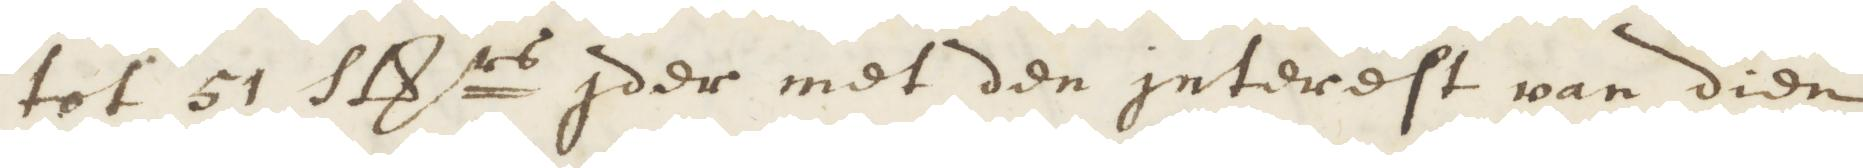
tot 51 stver=rs jder met den jnterest van dien
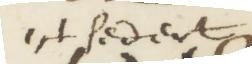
„t sedert
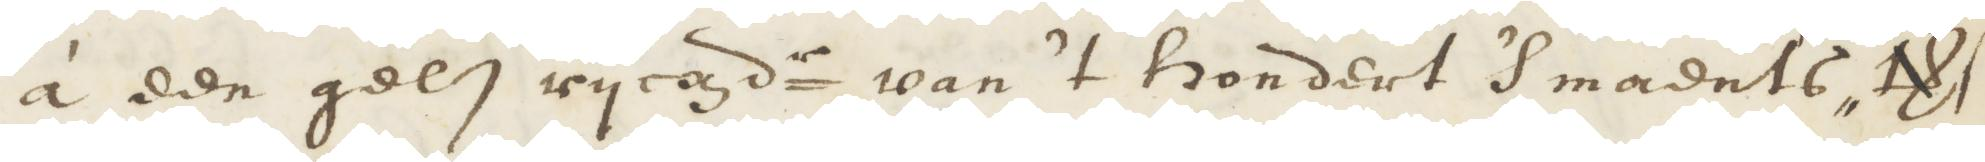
á een gelijk rijcxd=r van ’t hondert 's maents „ vert
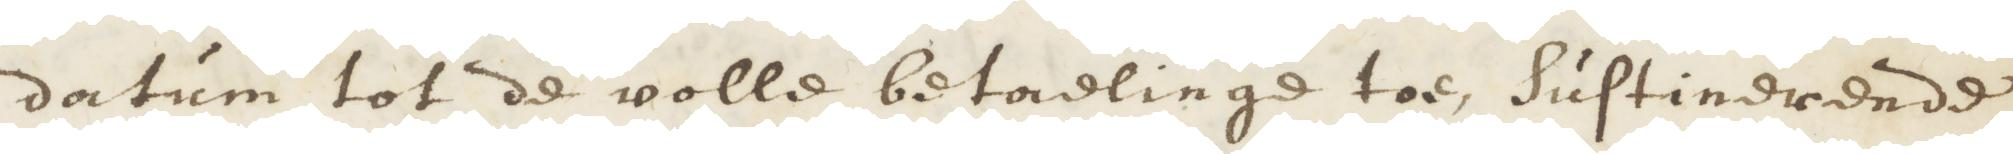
datum tot de volle betaelinge toe, sustinerende
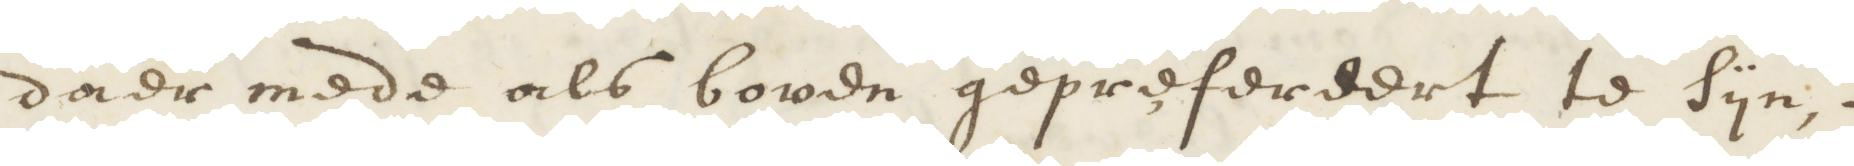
daer mede als boven geprefereert te sijn,
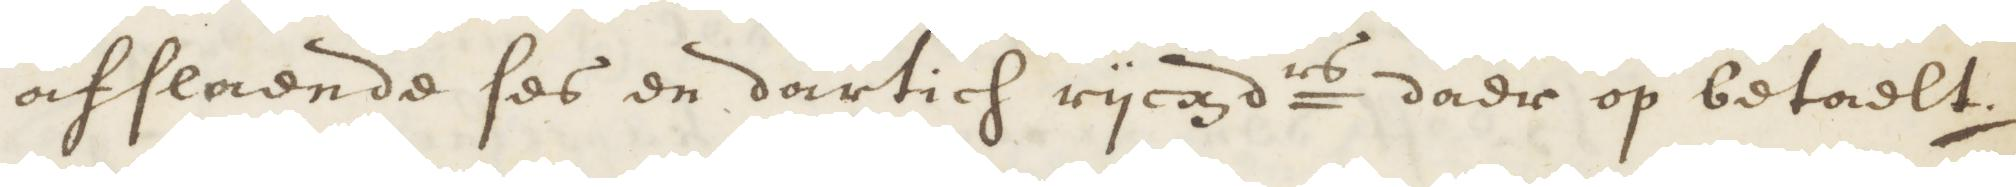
afslaende ses en dartich rijcxd=rs daer op betaelt.
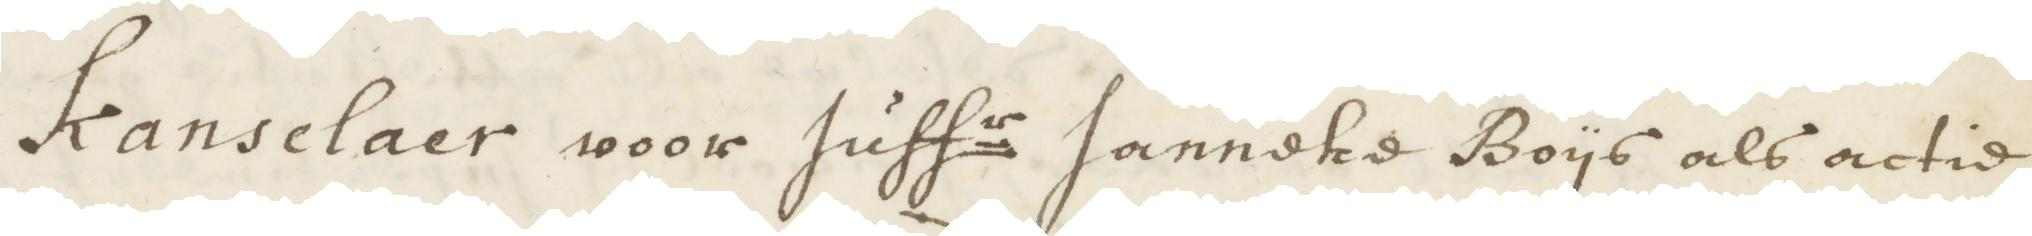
Kanselaer voor Juff=r Janneke Boijs als actie
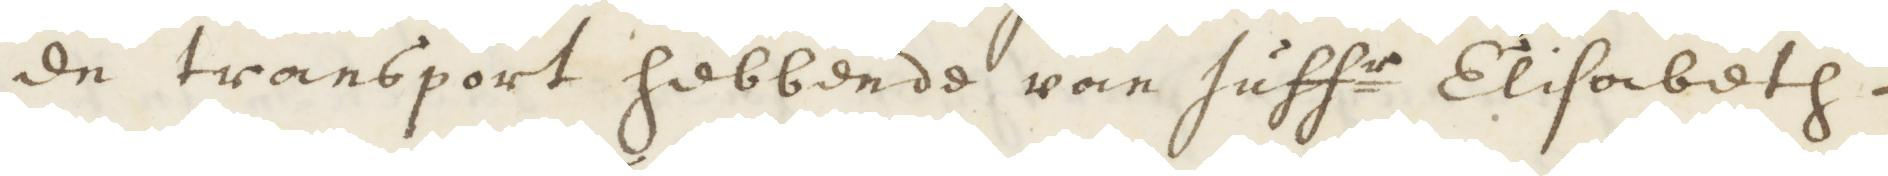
en transport hebbende van Juff=r Elisabeth
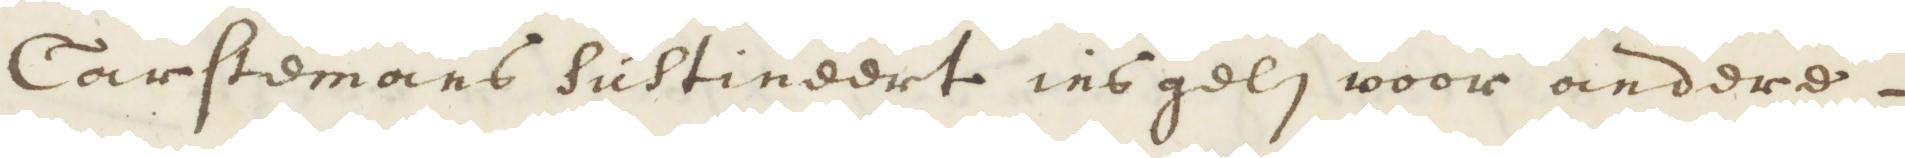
Carstemans sustineert insgelijk voor andere —
